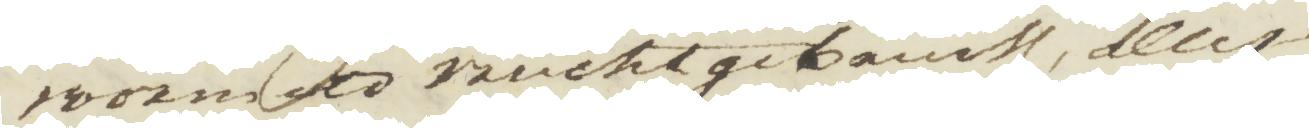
voormeld vruchtgebruik, alles
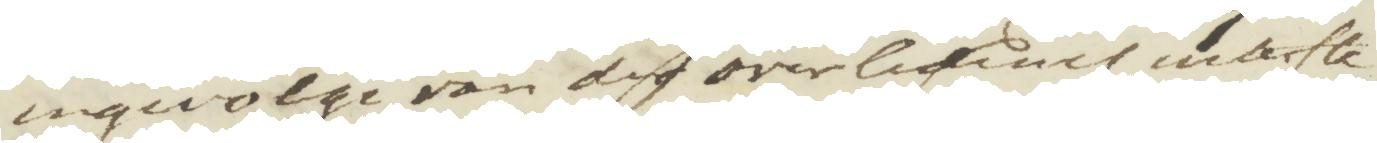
ingevolge van de overledens uiterste
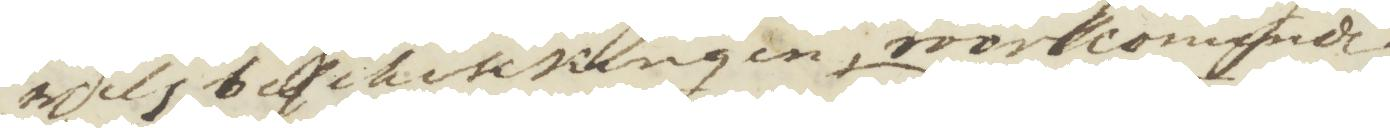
wils beschikkingen, voorkomende
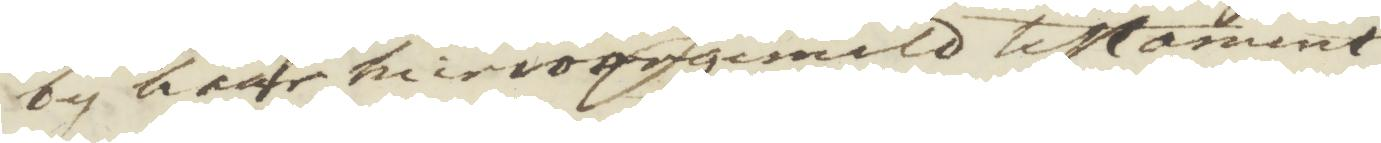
by haar hiervoorgemeld testament
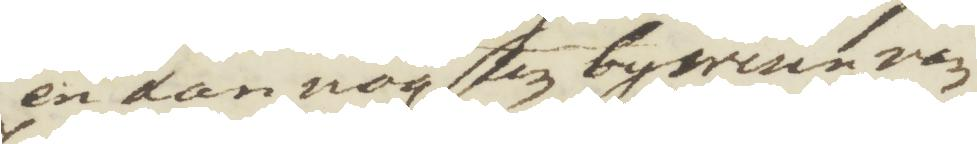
en dan nog ten bywezen van
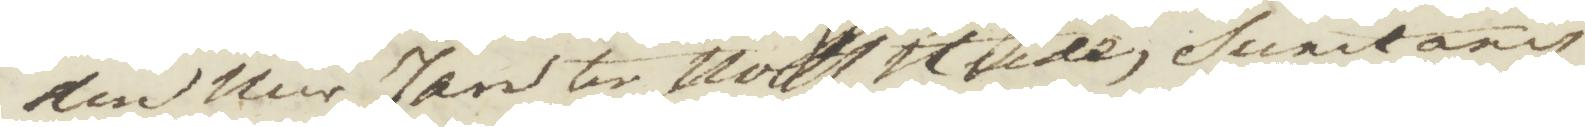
den Heer Jan ter Hooff steeden secretaris
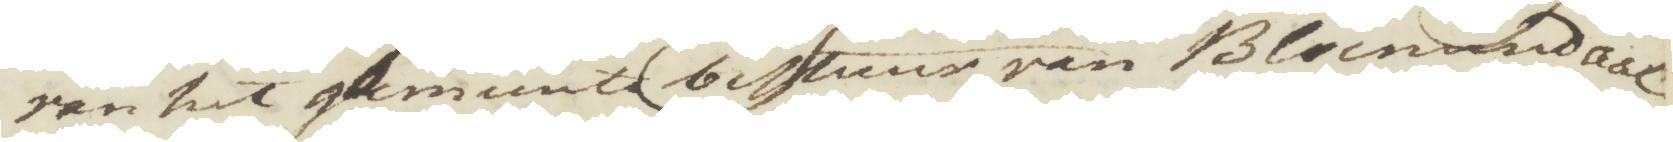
van het gemeente bestuur van Bloemendaal
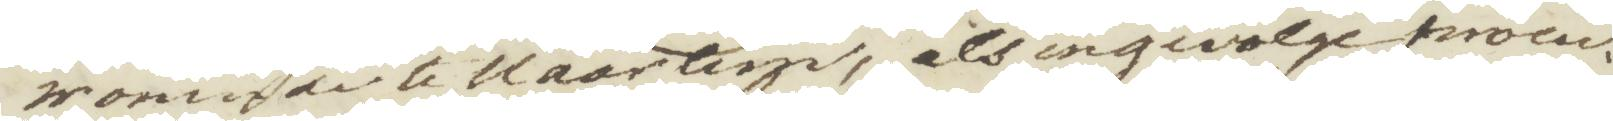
wonende te Haarlem, als ingevolge procu„
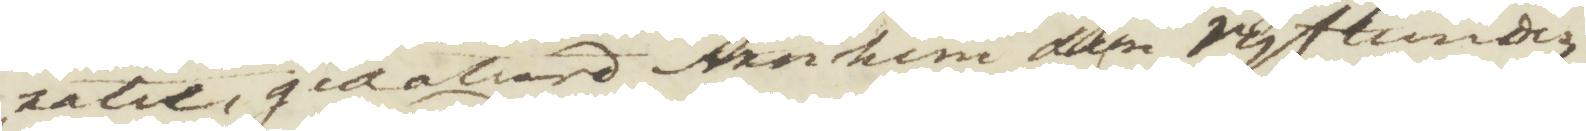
ratie, gedateerd Arnhem den vyftienden
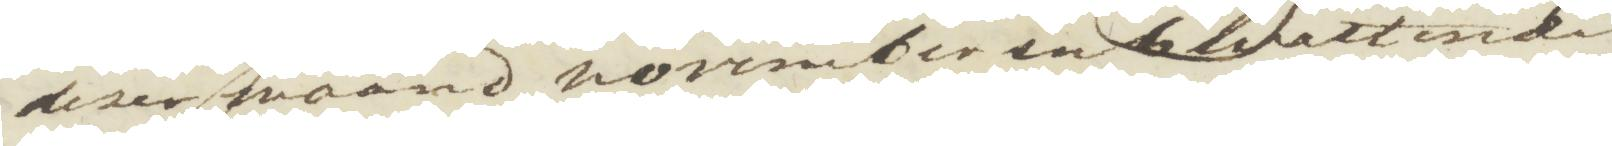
dezer maand november en bevattende
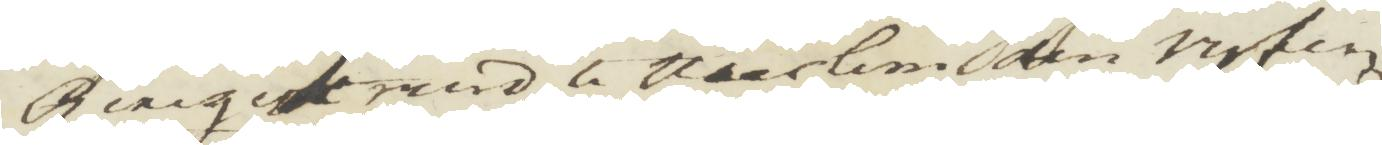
Geregistreerd te Haarlem den vyfen
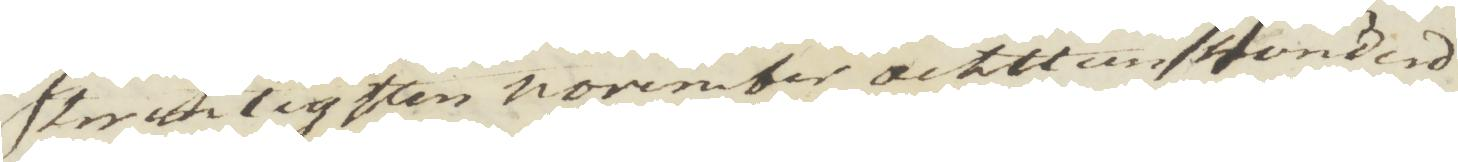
twintigsten november achttien Honderd
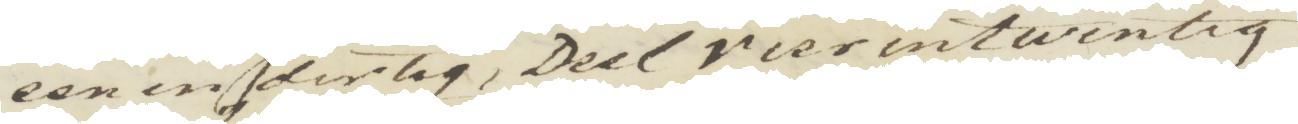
een en dertig, Deel vier in twintig
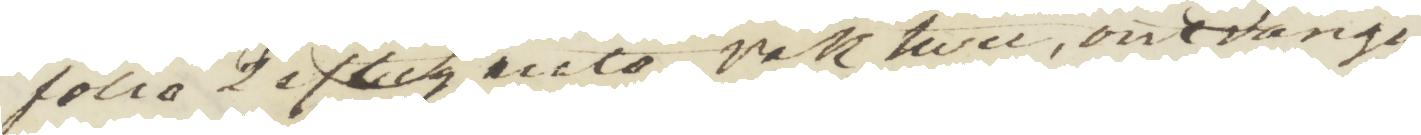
folio Zestig recto, vak twee, ontvangen
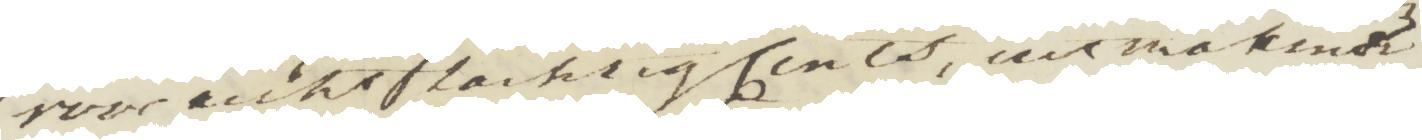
voor recht tachtig Cents, uitmakende
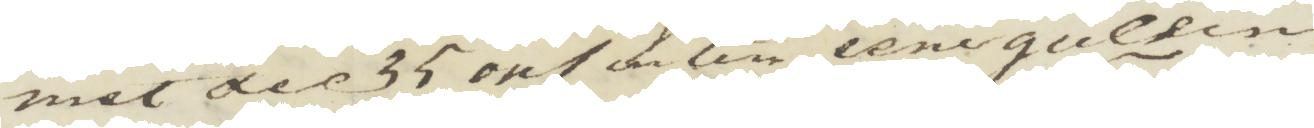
met des 35 opCenten eene gulden
